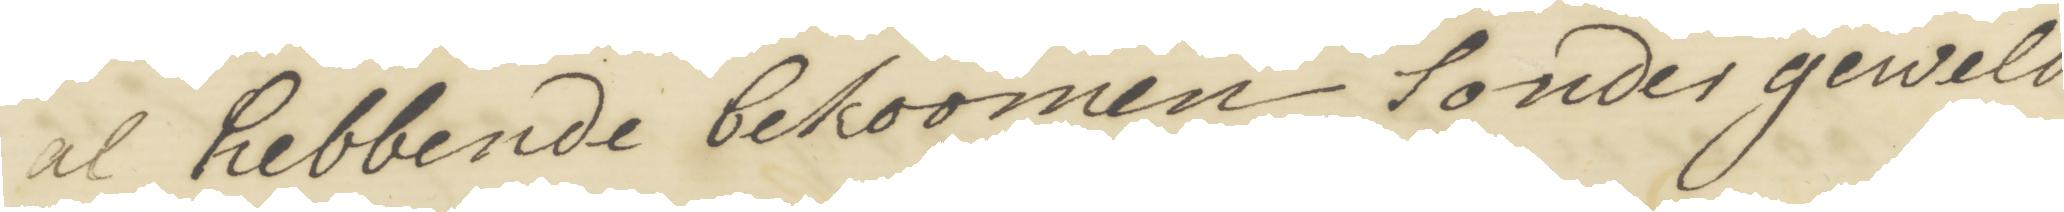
al hebbende bekoomen sonder geweld
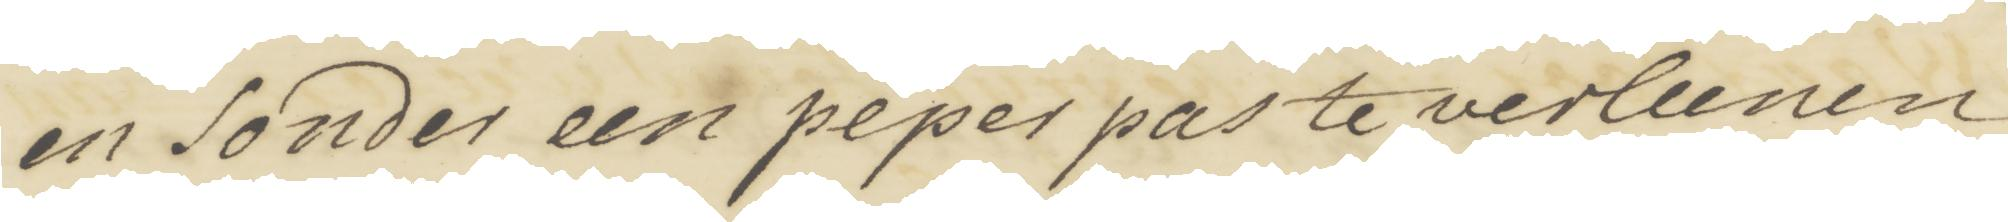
en sonder een peper pas te verleenen
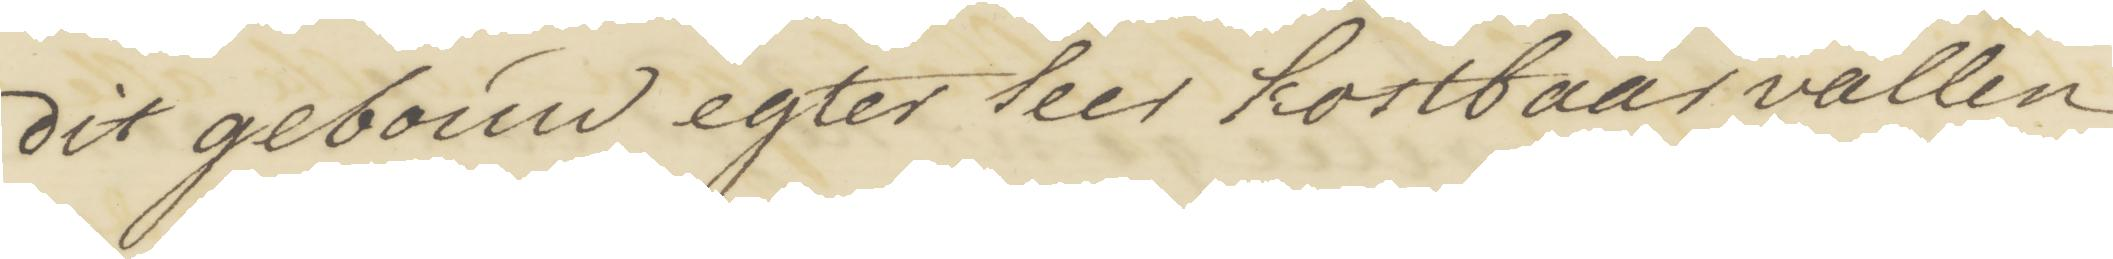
dit gebouw egter seer kostbaar vallen
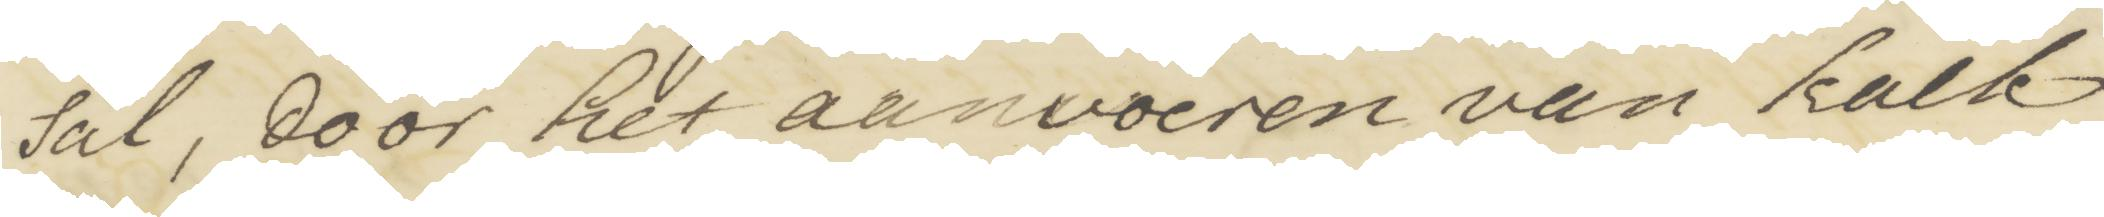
sal, door het aanvoeren van kalk
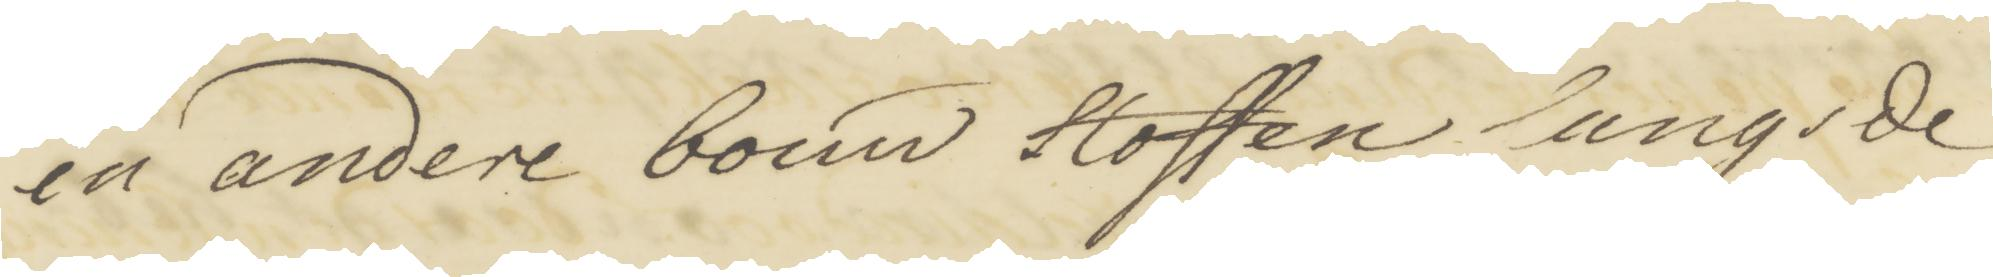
en andere bouw stoffen langs de
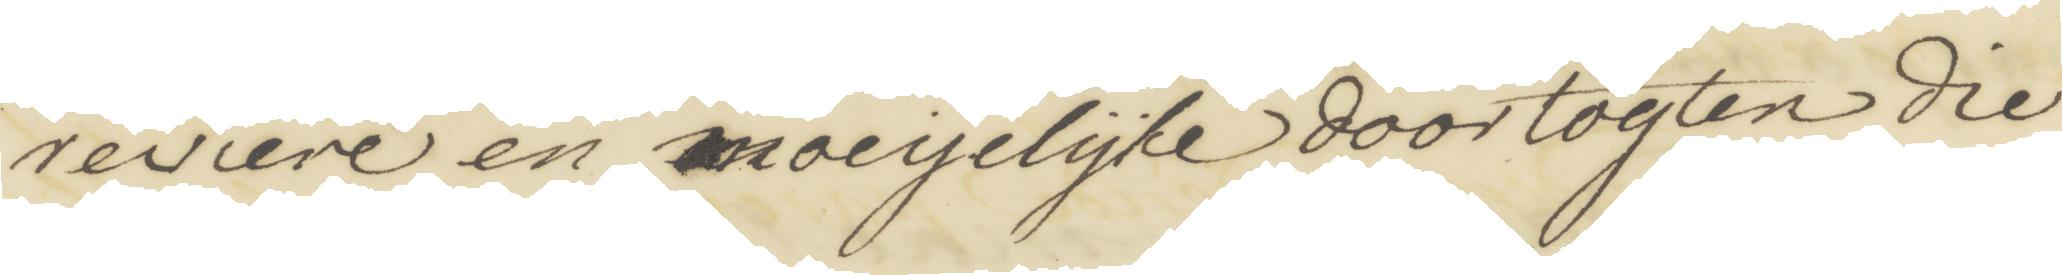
reviere en moeijelijke doortogten die
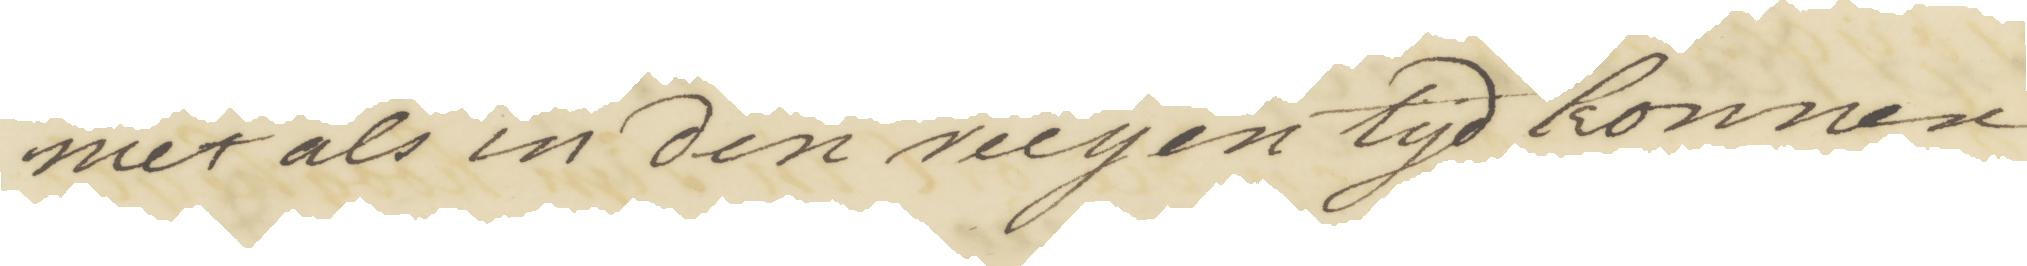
niet als in den reegen tijd konnen
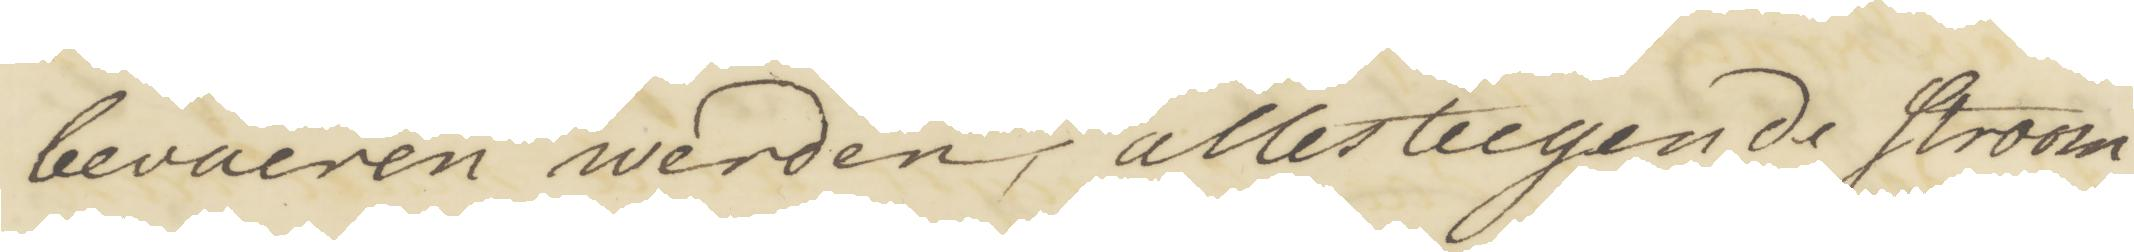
bevaeren werden, alles teegen de stroom
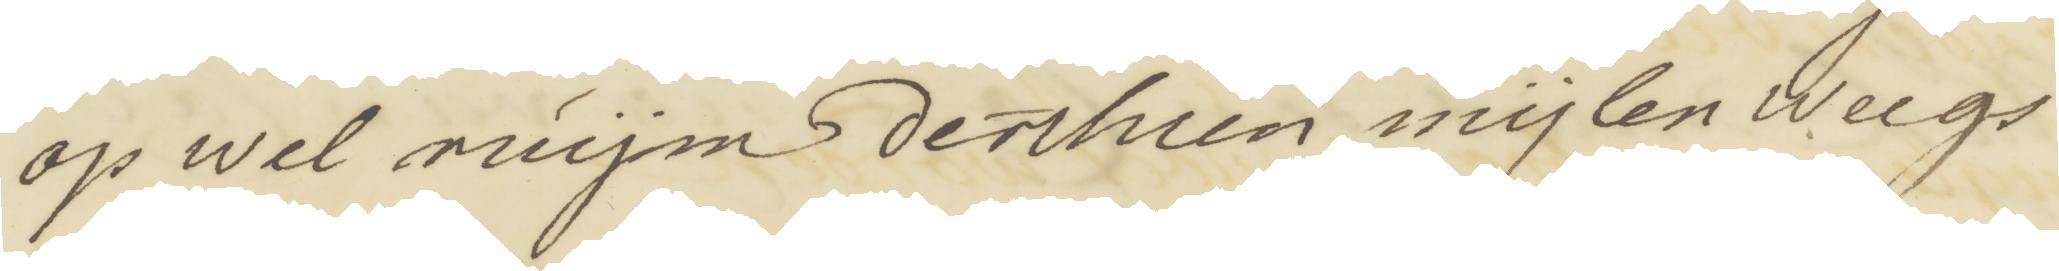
op wel ruijm derthien mijlen weegs
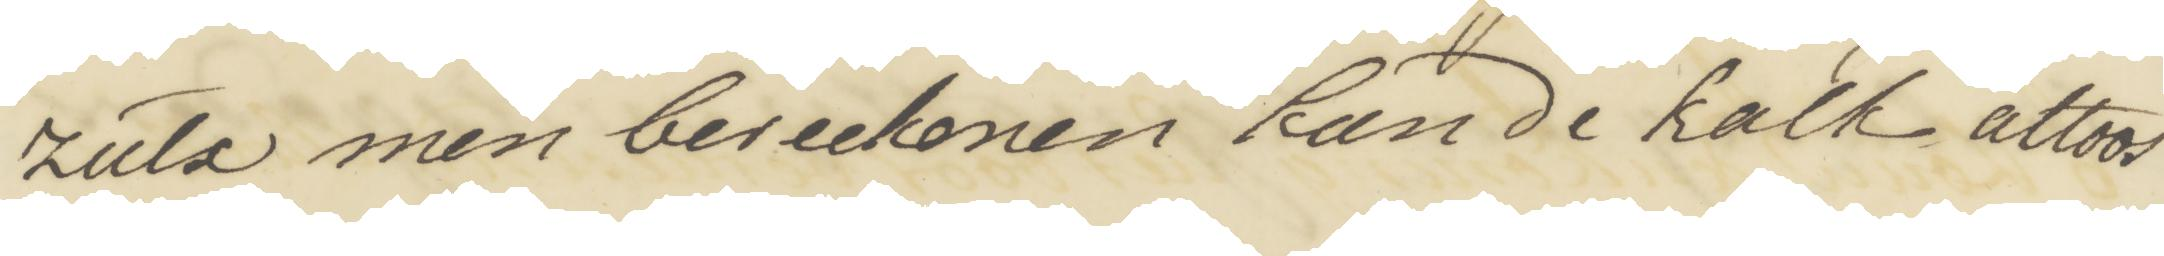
zulx men bereekenen kan de kalk altoos
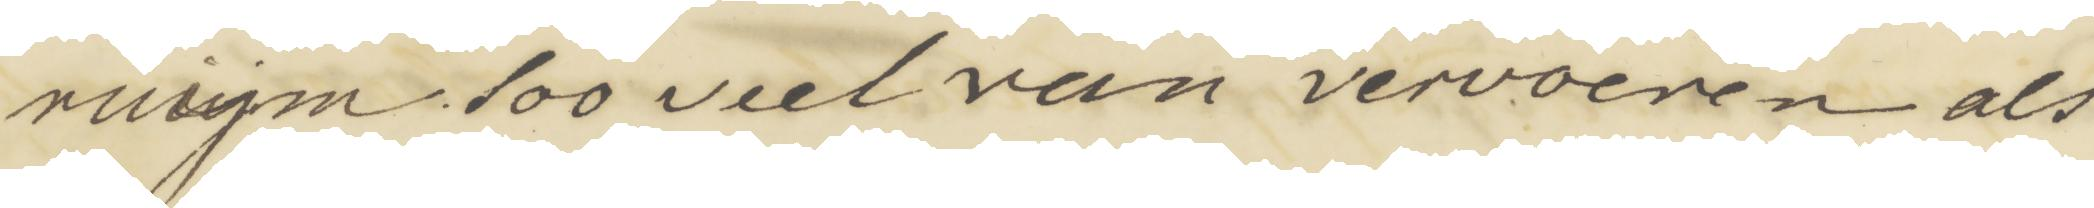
ruijm soo veel van vervoeren als
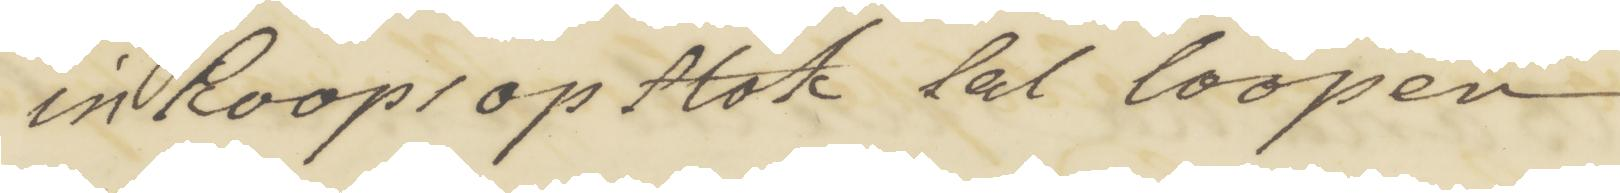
in koop op stok sal loopen
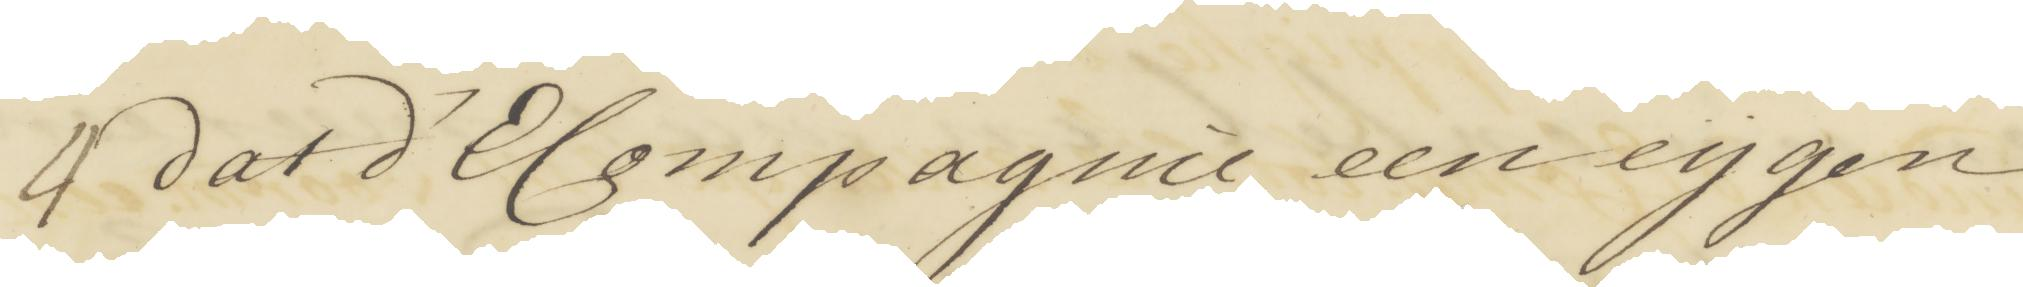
4 dat d’ ECompagnie een eijgen
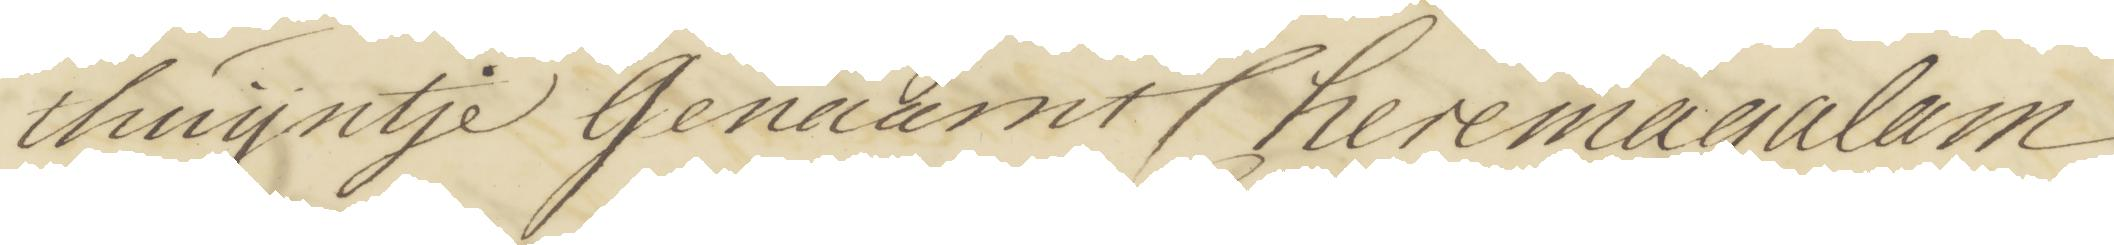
thuijntje genaamt Cheremagalam
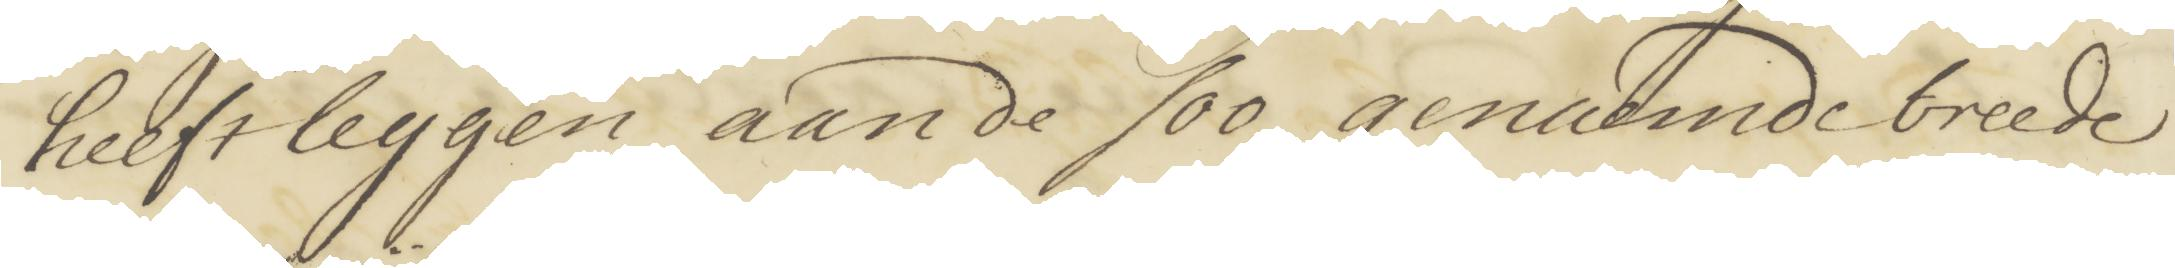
heeft leggen aan de soo genaemde breede
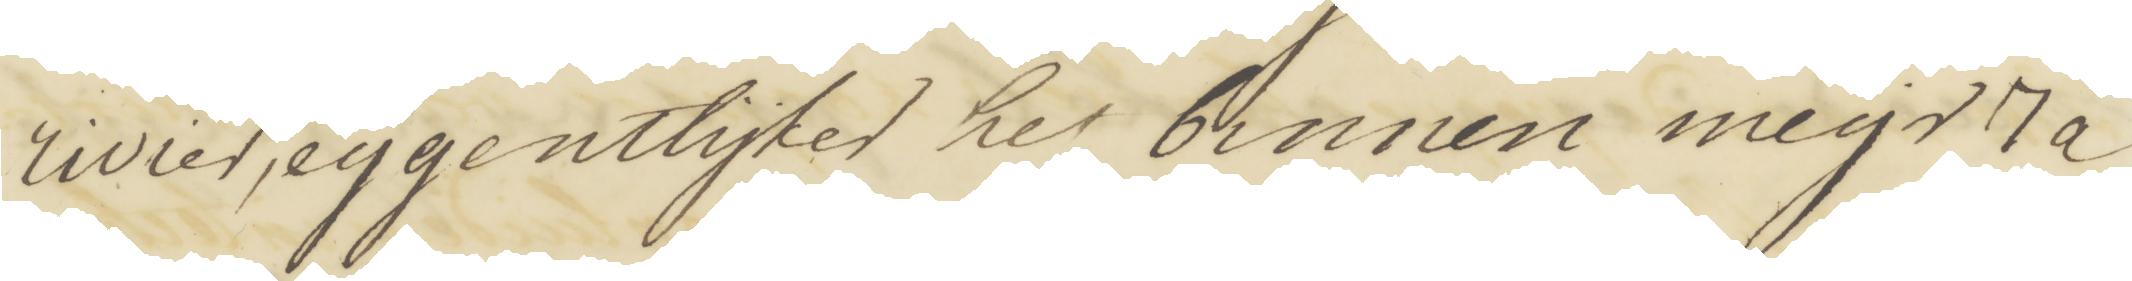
rivier, eijgentlijker het binnen meijr 7 a
